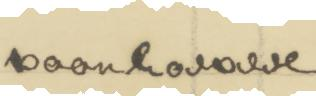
voor hoeveel
